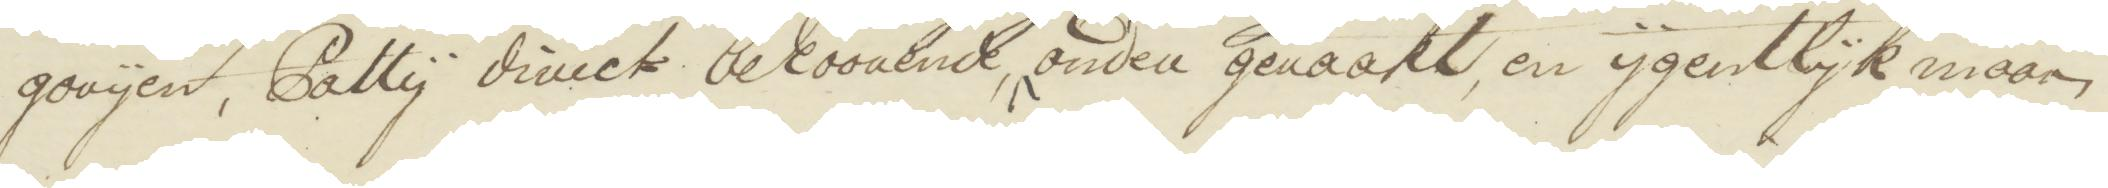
gorijen, Pattij direct behoorende, ^ onder geraakt, en ijgentlijk maar
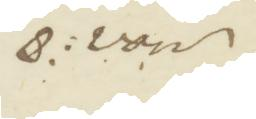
8.: van
